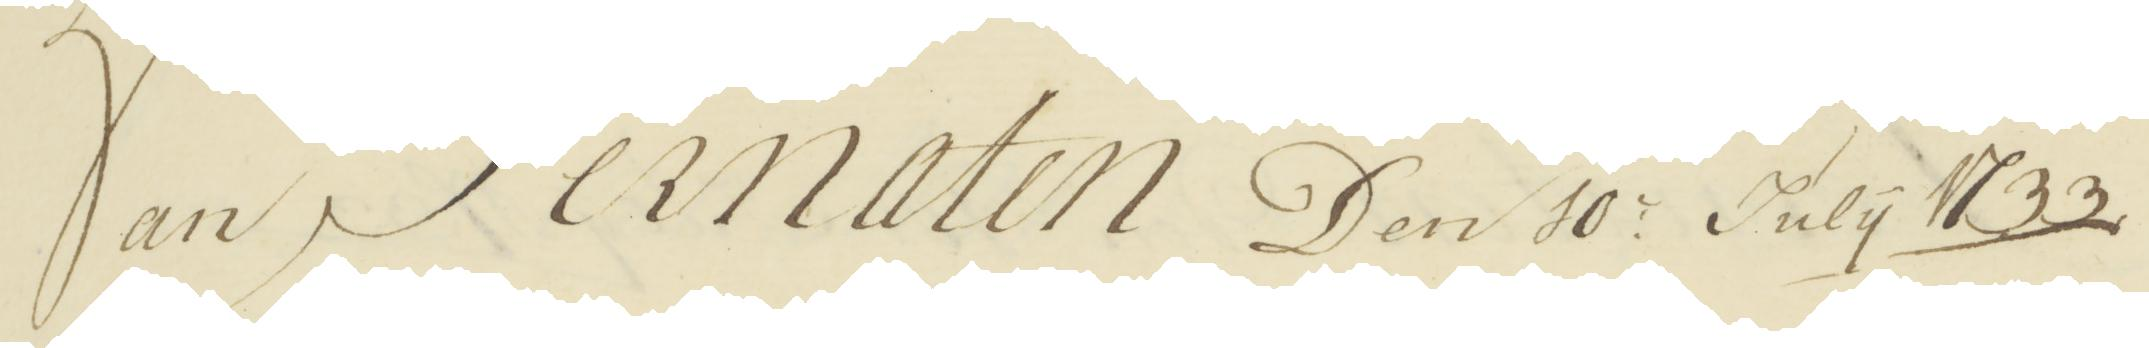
Van Termaten Den 10:e Iulij 1733.
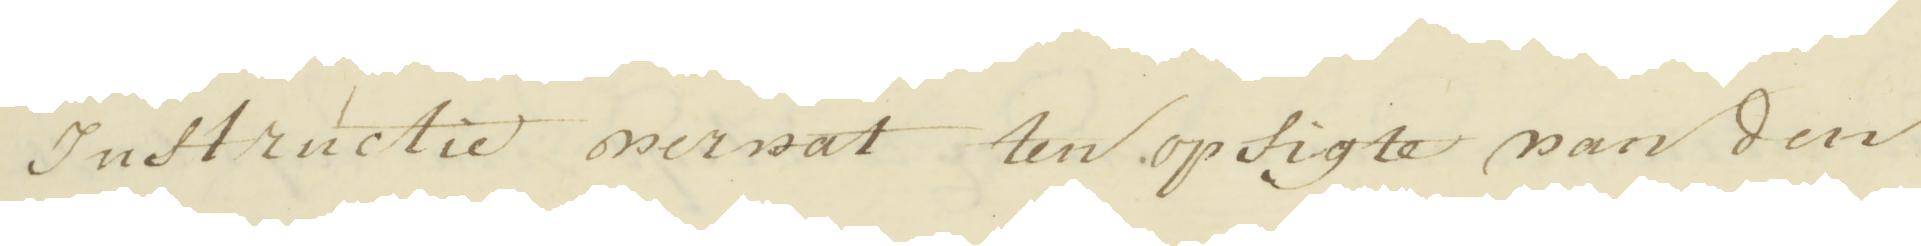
Instructie vervat ten opsigte van den
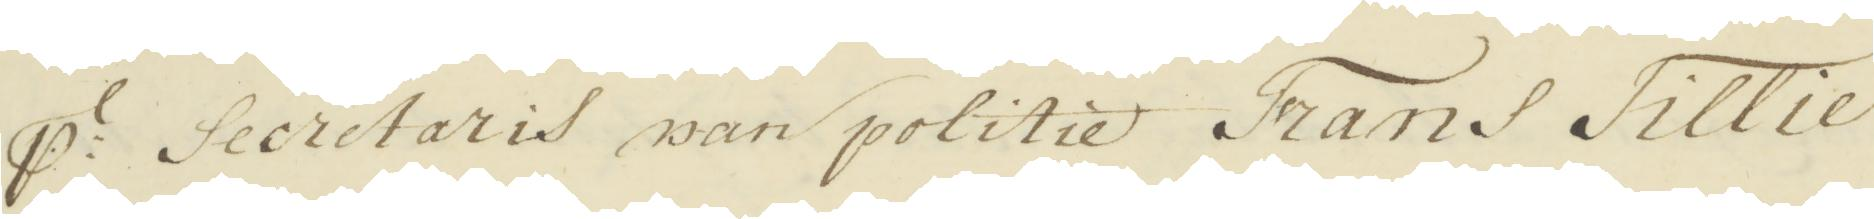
p:l secretaris van politie Trans Tillie
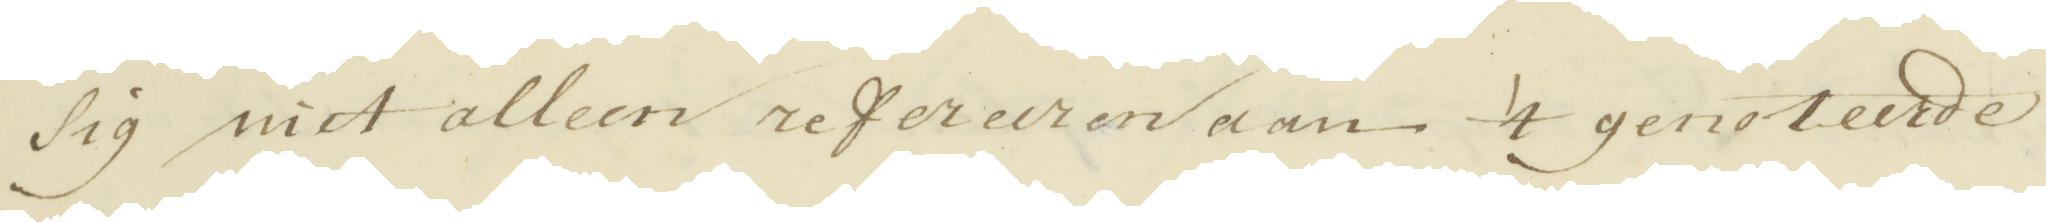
sig niet alleen refereeren aan ’t genoteerde
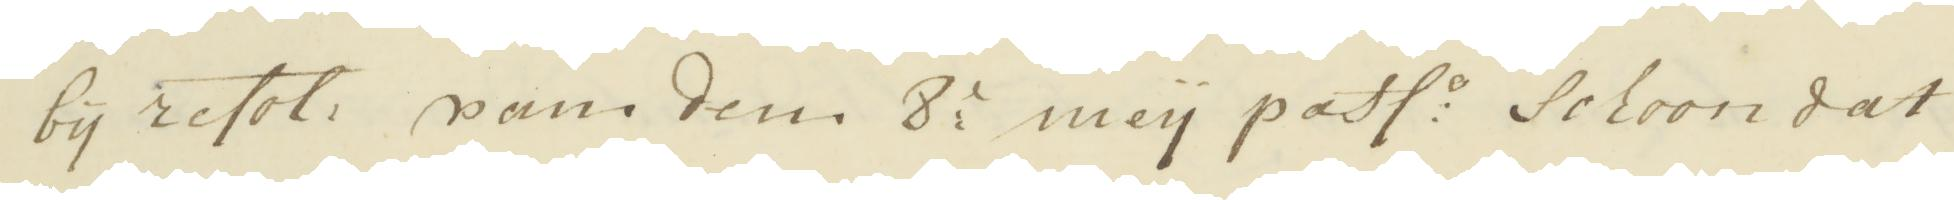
bij resol: van den 8:e meij pass:o schoon dat
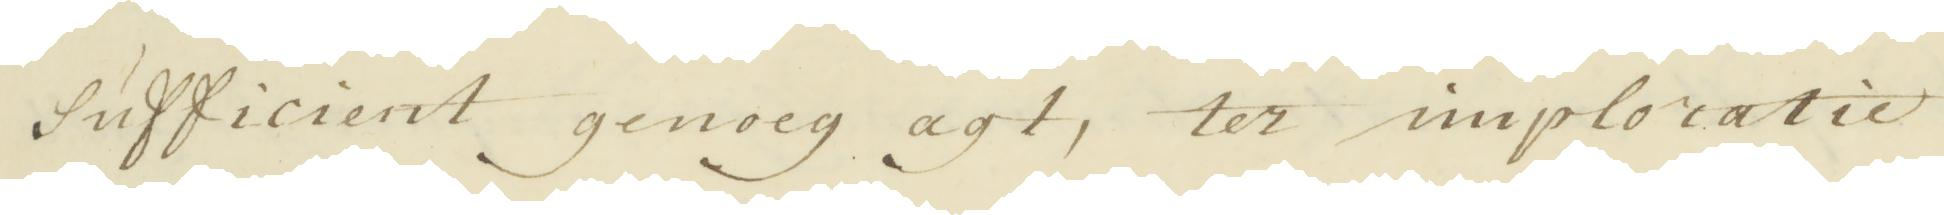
sufficient genoeg agt, ter imploratie
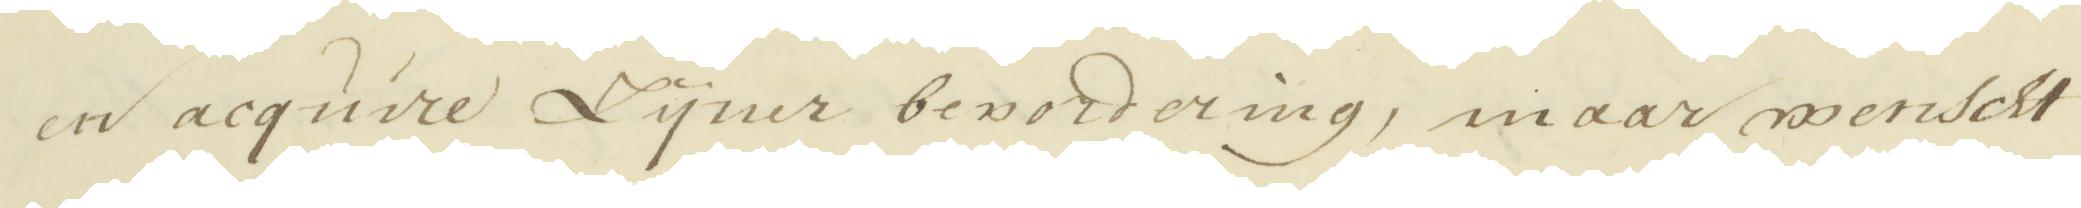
en acquire zijner bevordering, maar wenscht
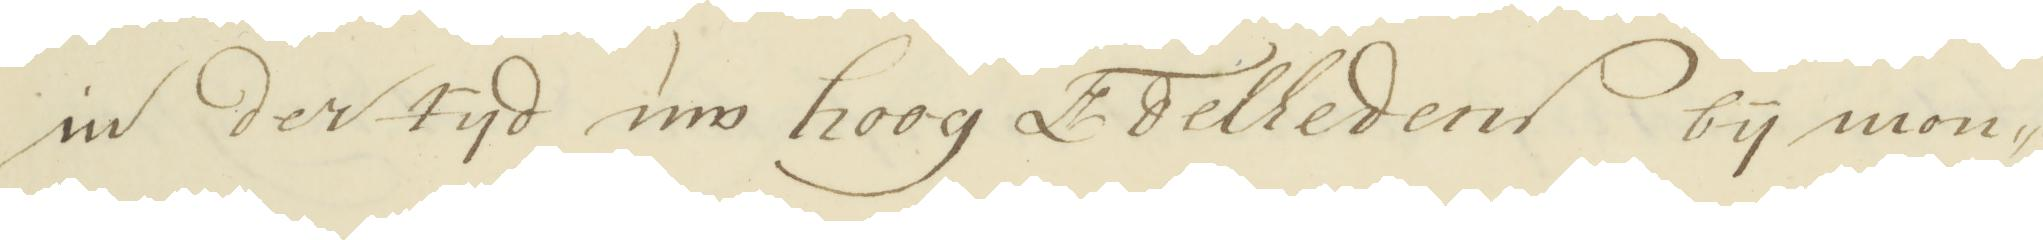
in der tyd uw hoog Edelhedens bij mon„
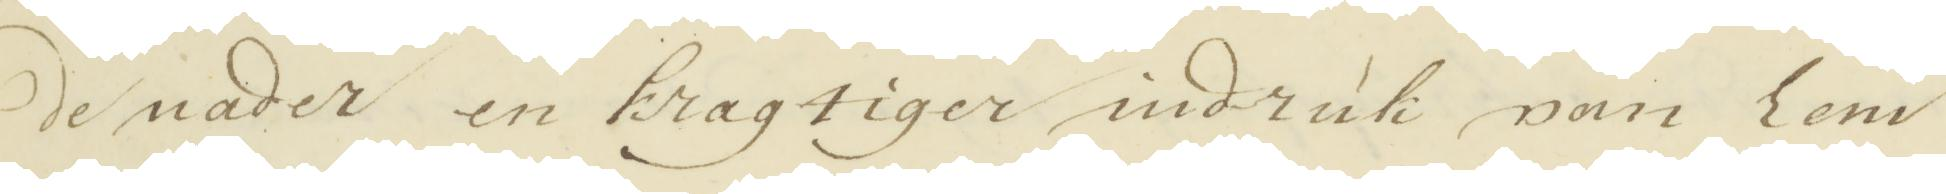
de nader en kragtiger indruk van hem
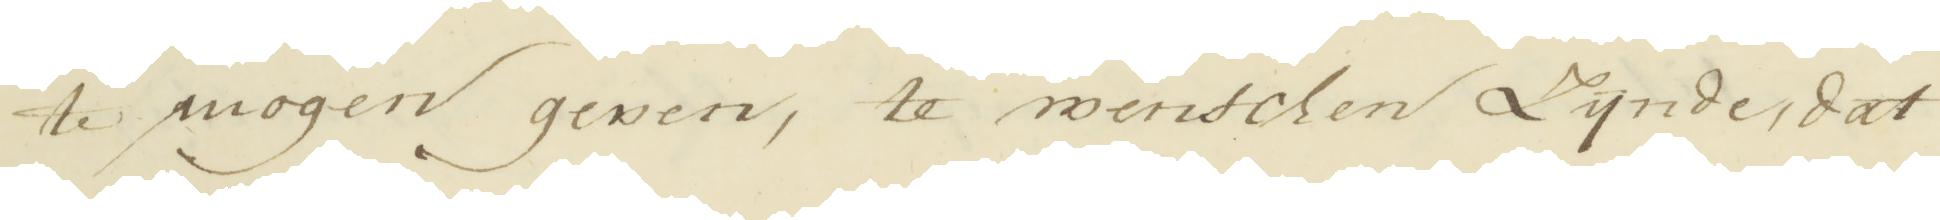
te mogen geven, te wenschen zijnde, dat
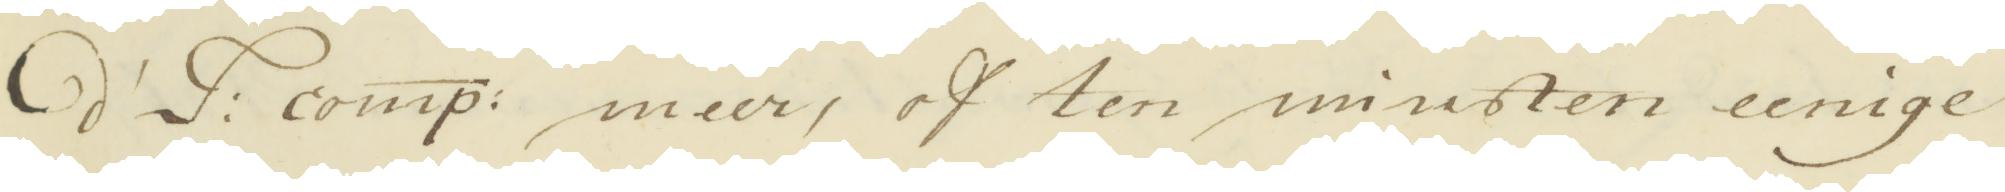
d’ E: comp: meer, of ten minsten eenige
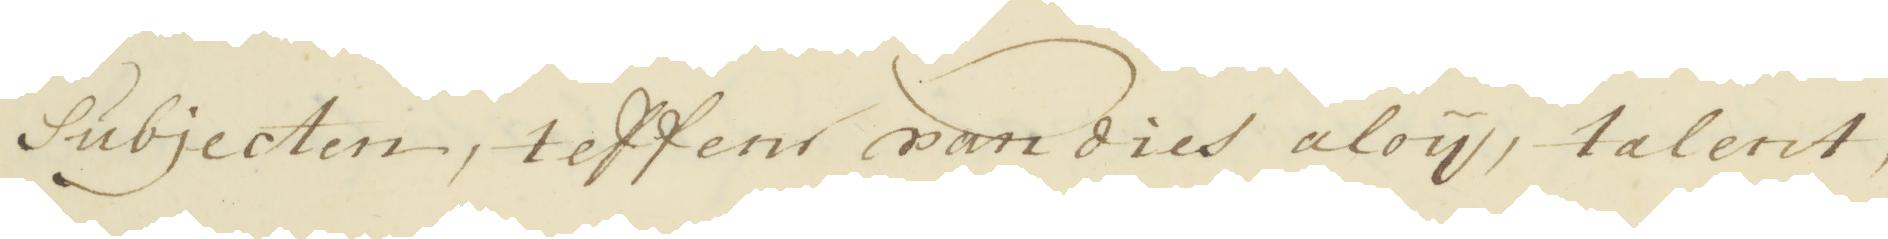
subjecten, teffens van dies aloij, talent
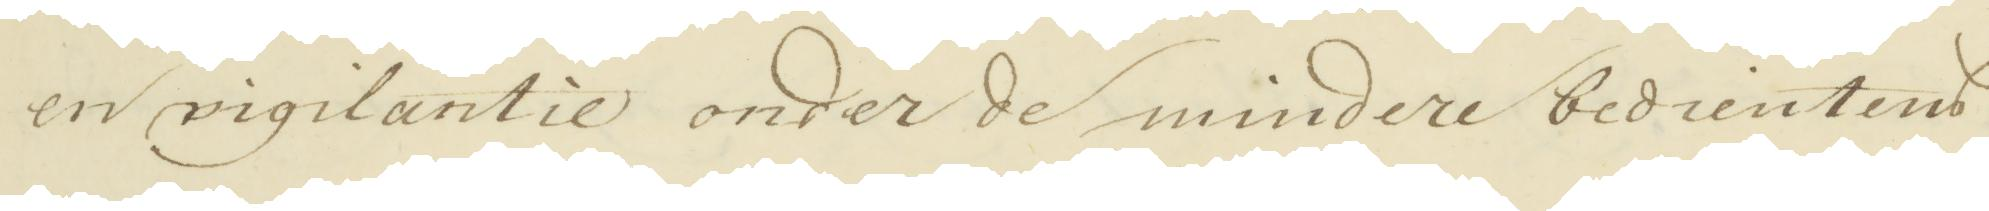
en vigilantie onder de mindere bedientens
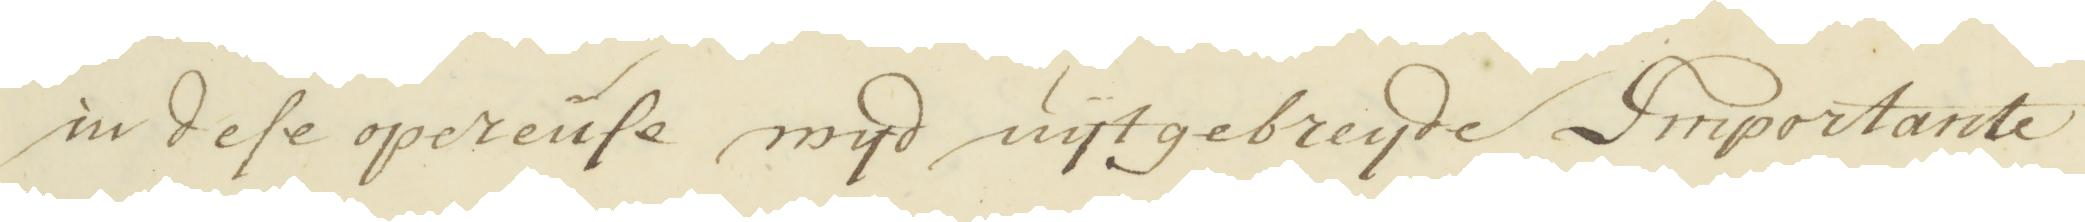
in dese opereuse wyd uijtgebreyde Emportante
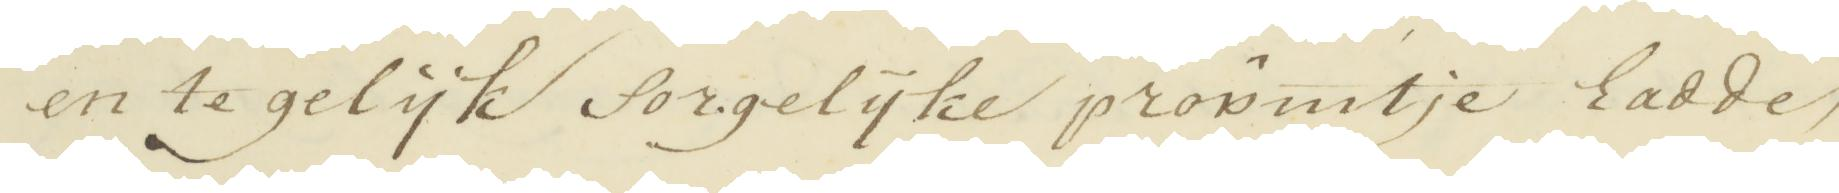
en te gelijk sorgelijke provintje hadde
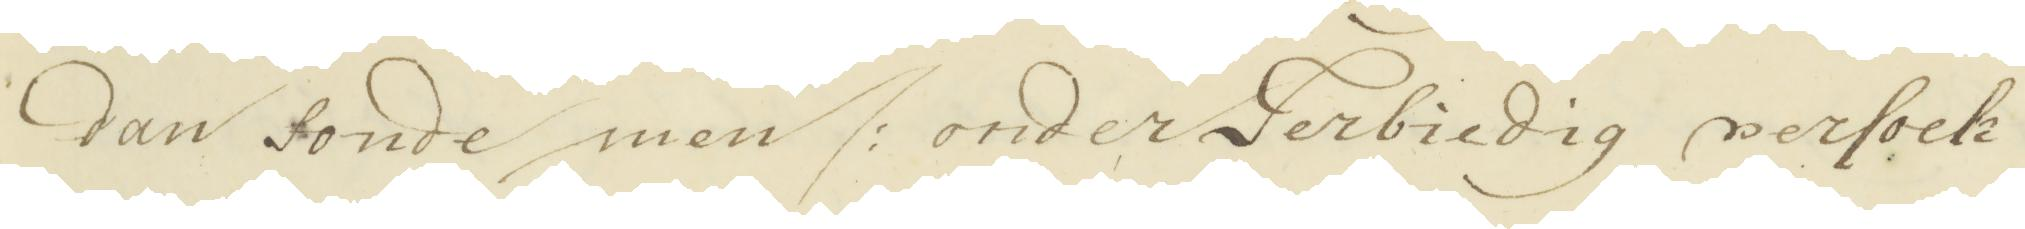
dan sonde men /: onder Eerbiedig versoek
